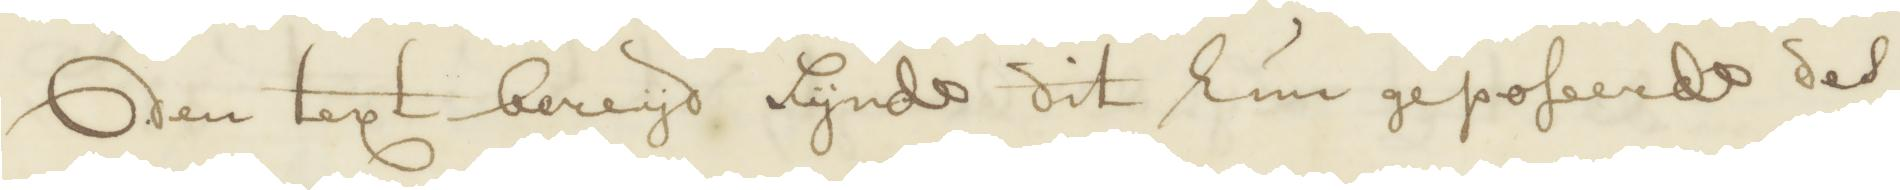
den text bereijd sijnde dit hun geposeerde des
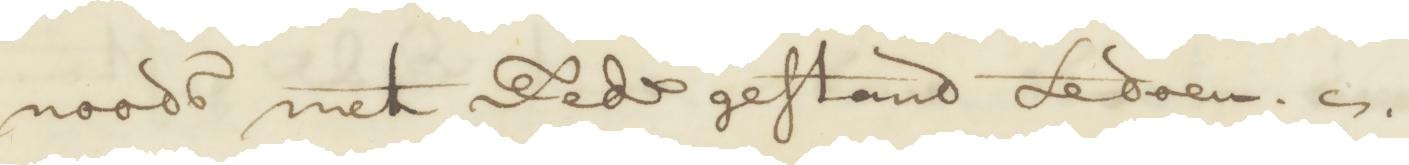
noods met Eede gestand te doen.
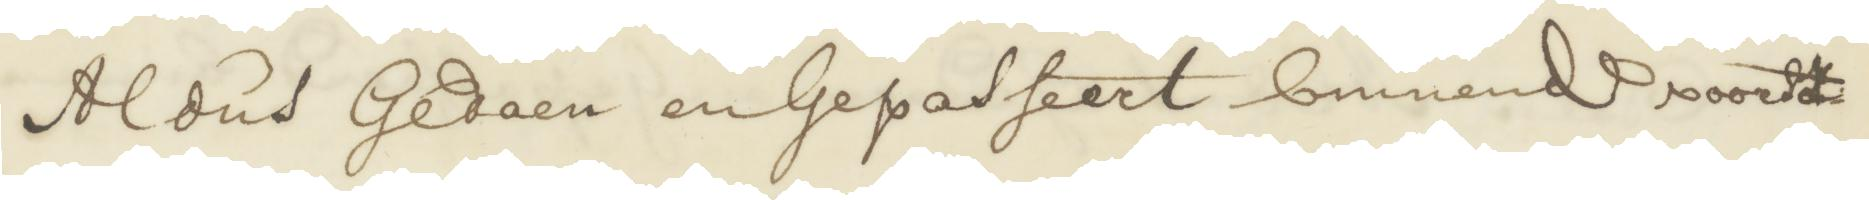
Aldus gedaen en gepasseert binnen de voorsz.
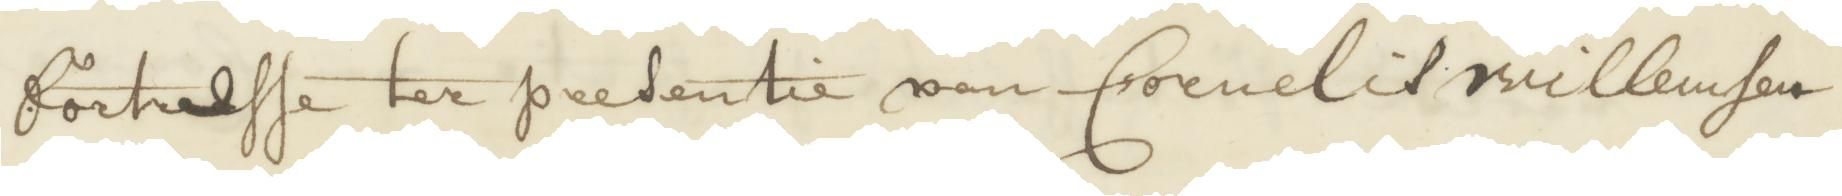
fortresse ter presentie van Cornelis willemsen
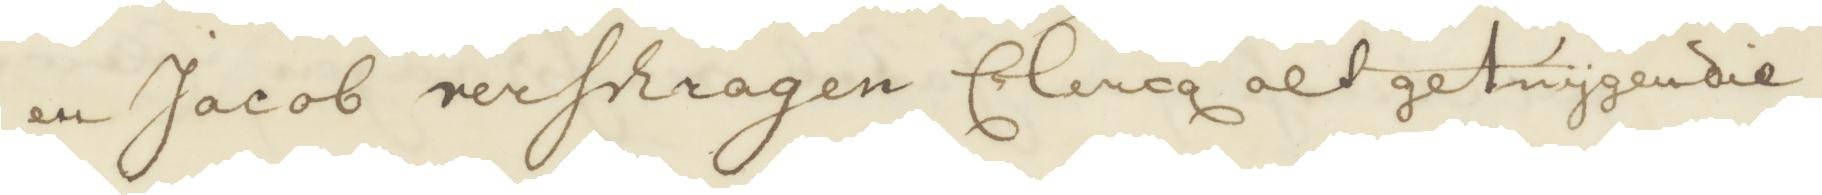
en Jacob verschragen, Clercq als getuijgen die
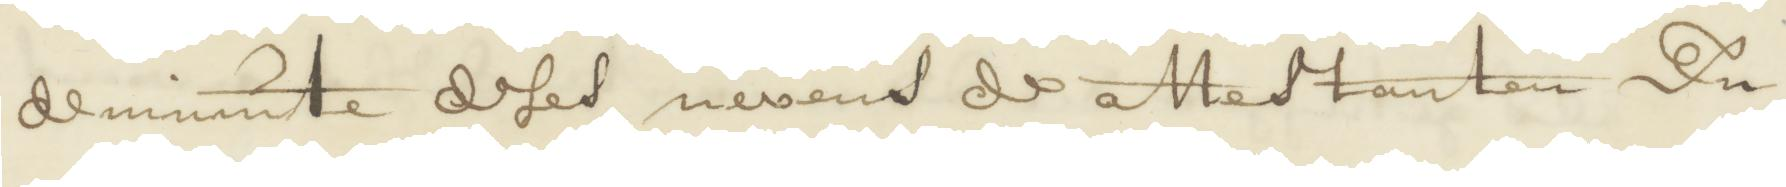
de minute deses nevens de attestanten En
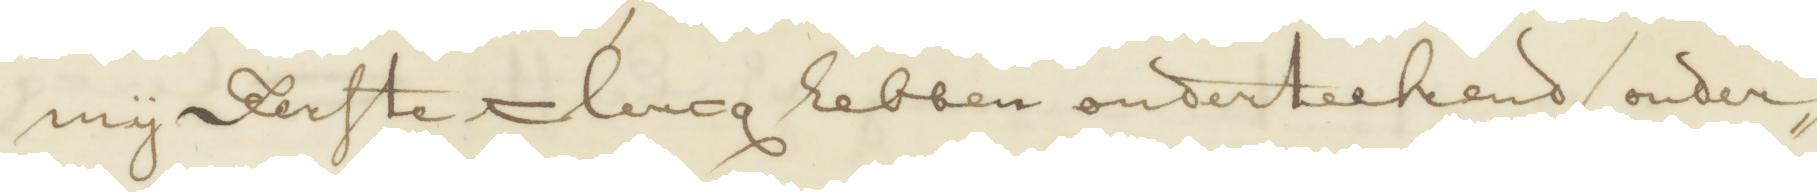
mij Eerste clercq hebben onderteekend /onder
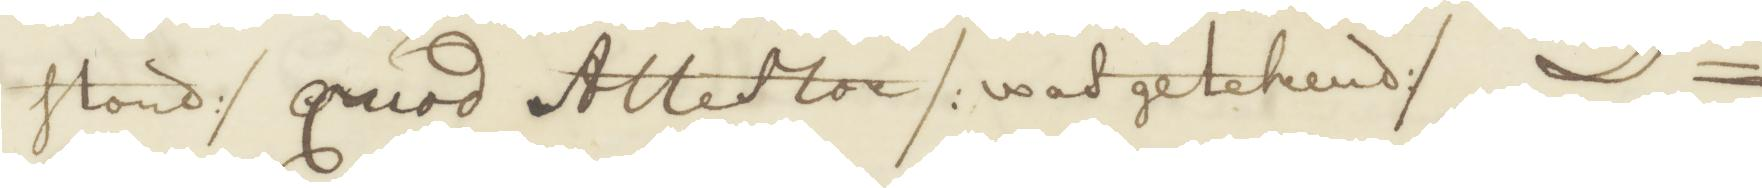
stond:/ quod Attestor /:was getekend:/ D=l
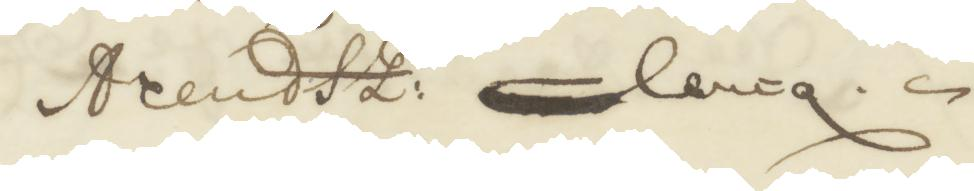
Arendsz: Clercq.
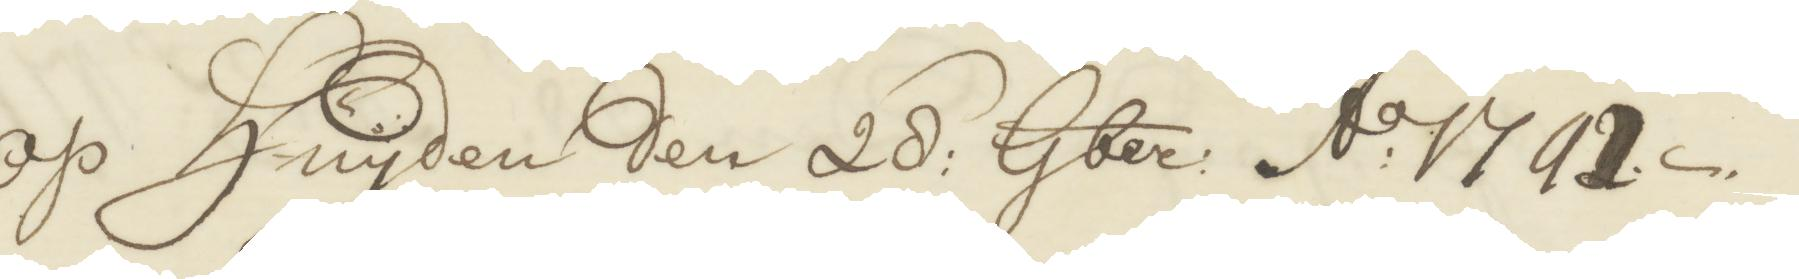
op Huijden den 28:' 9ber: A:o 1742.
